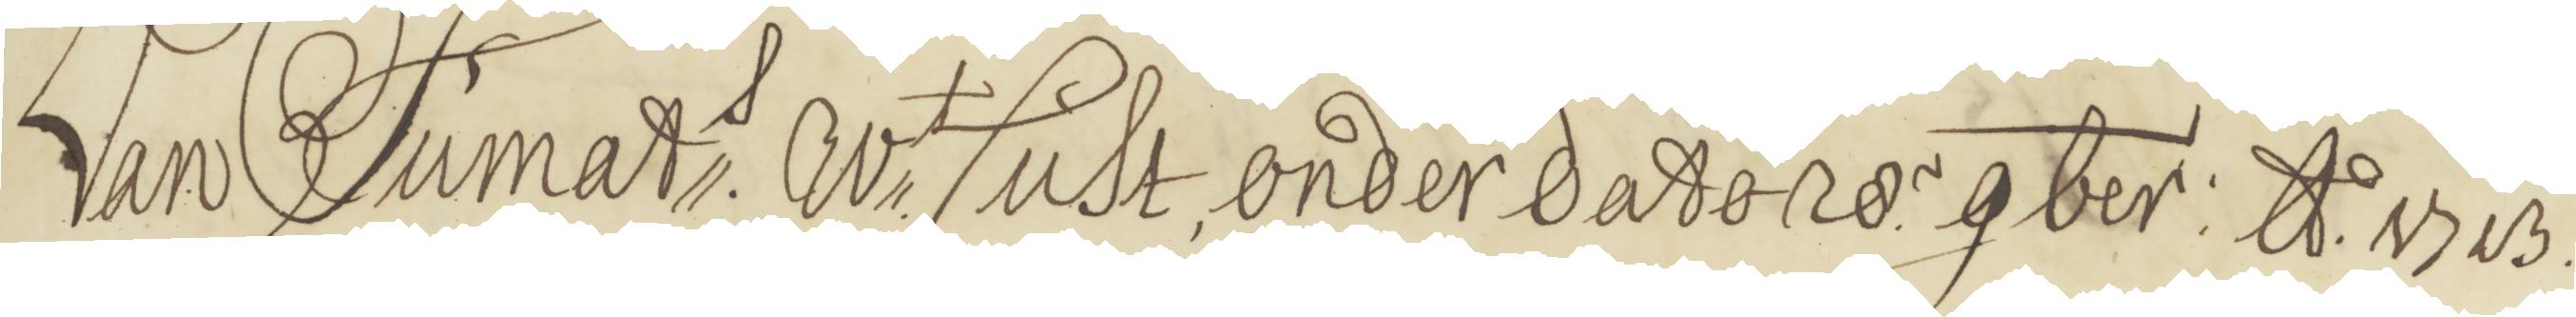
Van Sumat„s w„t Cust, onder dato 28.e 9ber: A.o 1713.
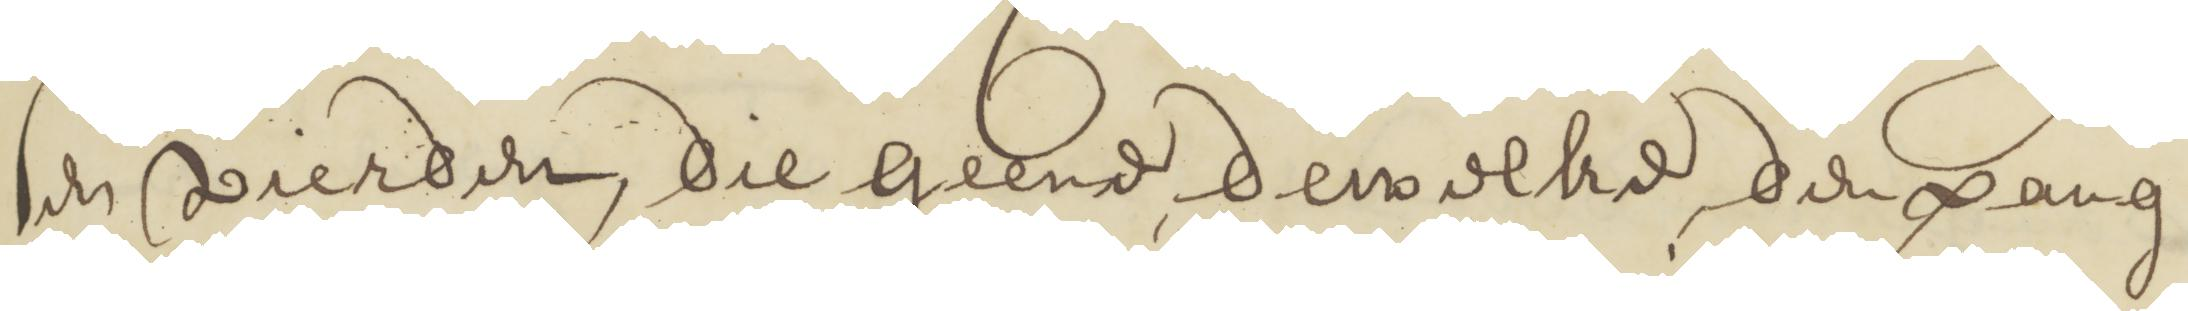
ten vierden, die geene, de welke, den pang
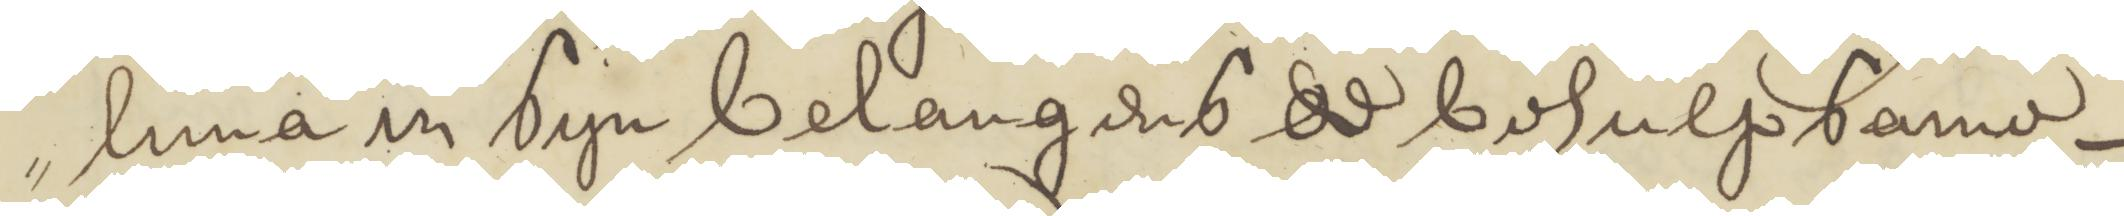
„lima in sijn belangens de behulpsame
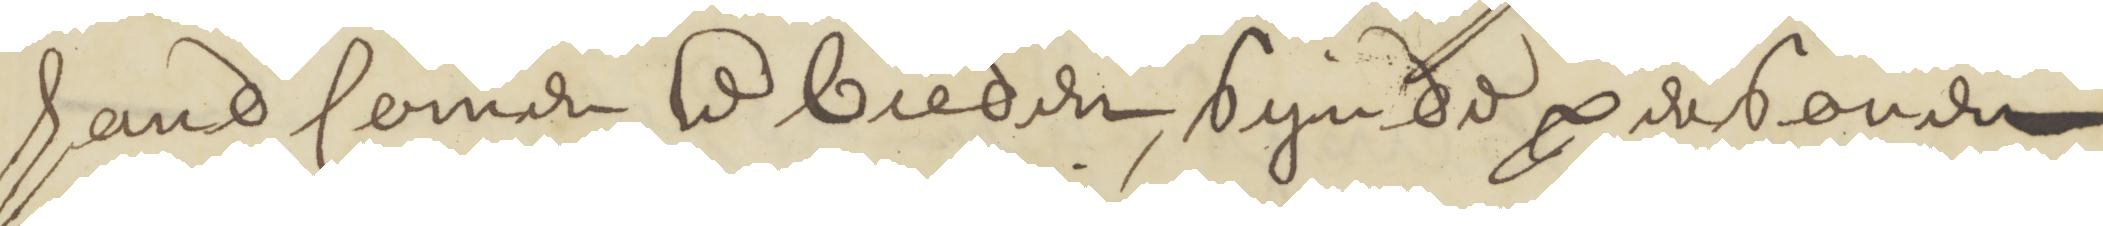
hand Comen te bieden, sijn de personen
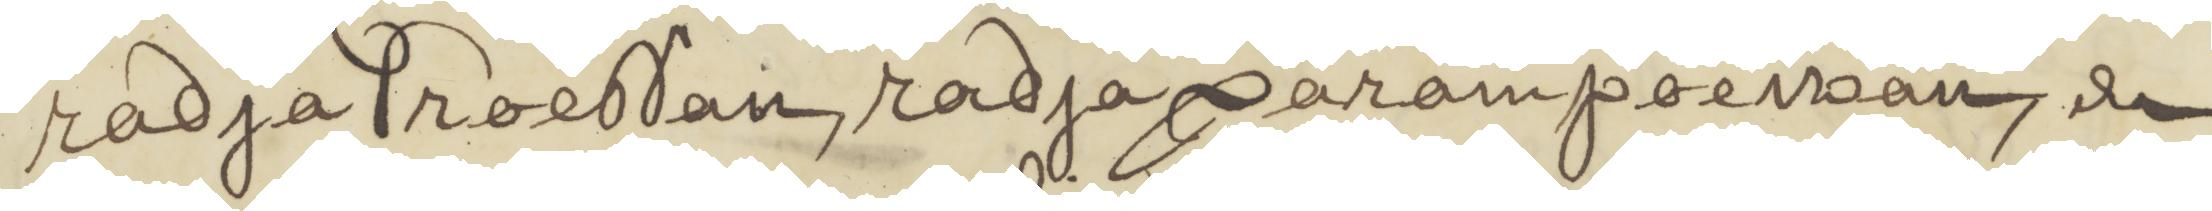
radja troessan, radja parampoewan, en
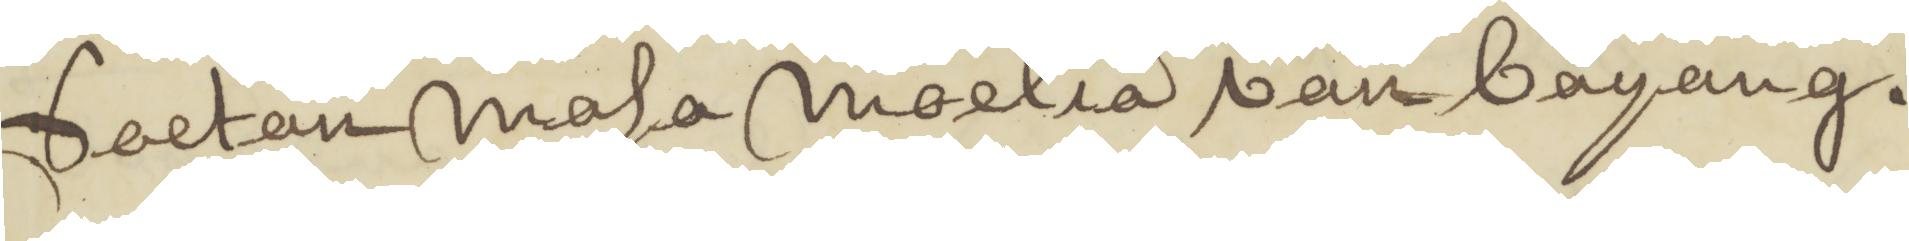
Soetan maha moelia van baijang.
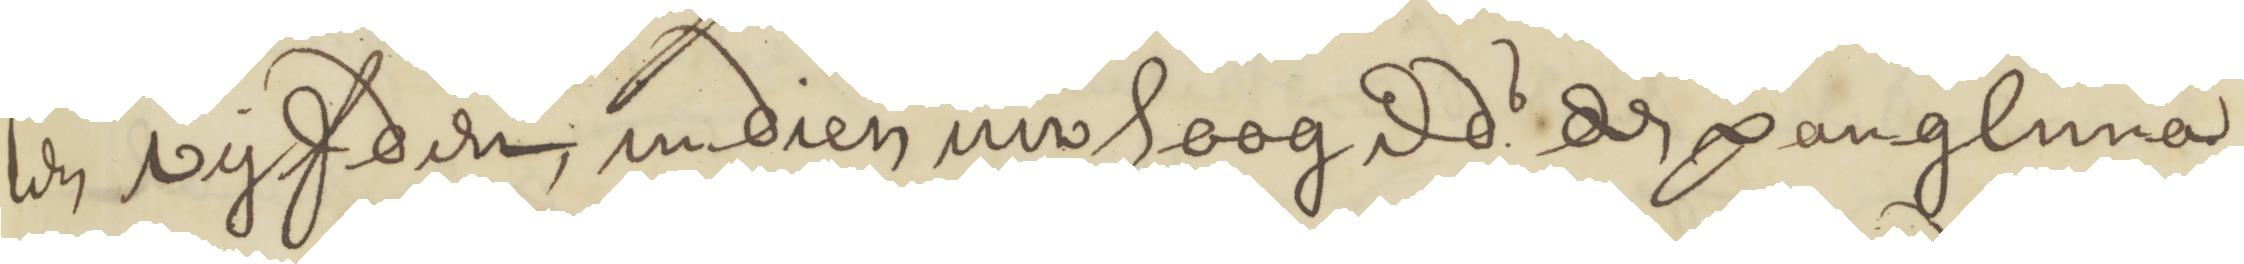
ten vijfden, indien uw hoog Ed.e den panglima
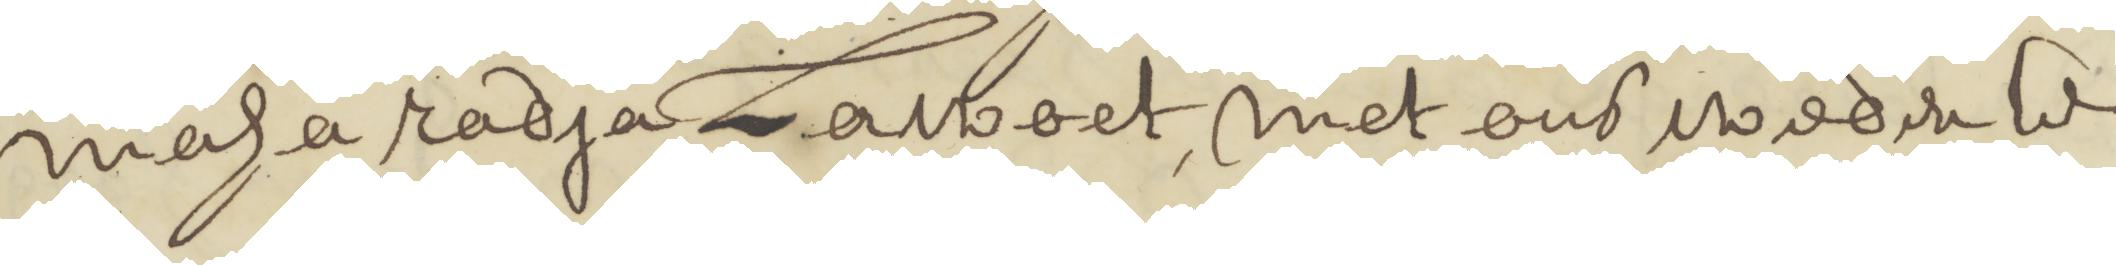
maha radja Lawoet, met ons weder te
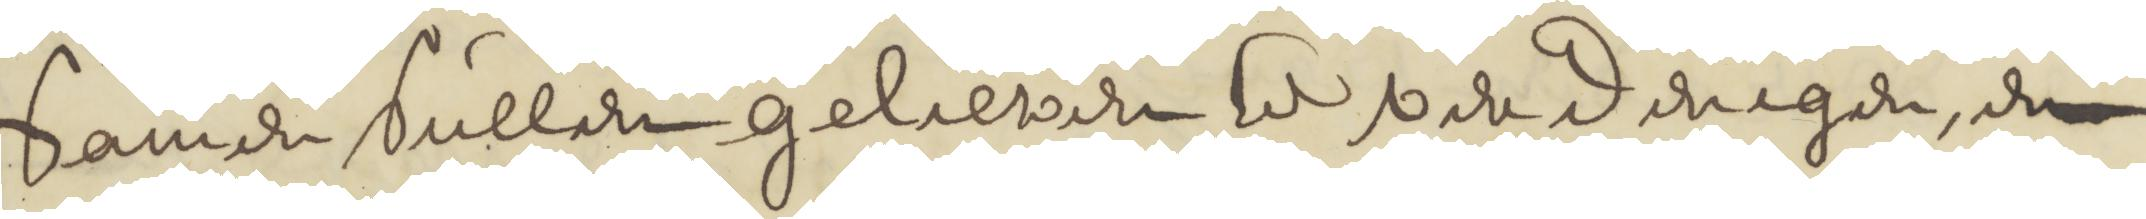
samen sullen gelieven te verEenigen, en
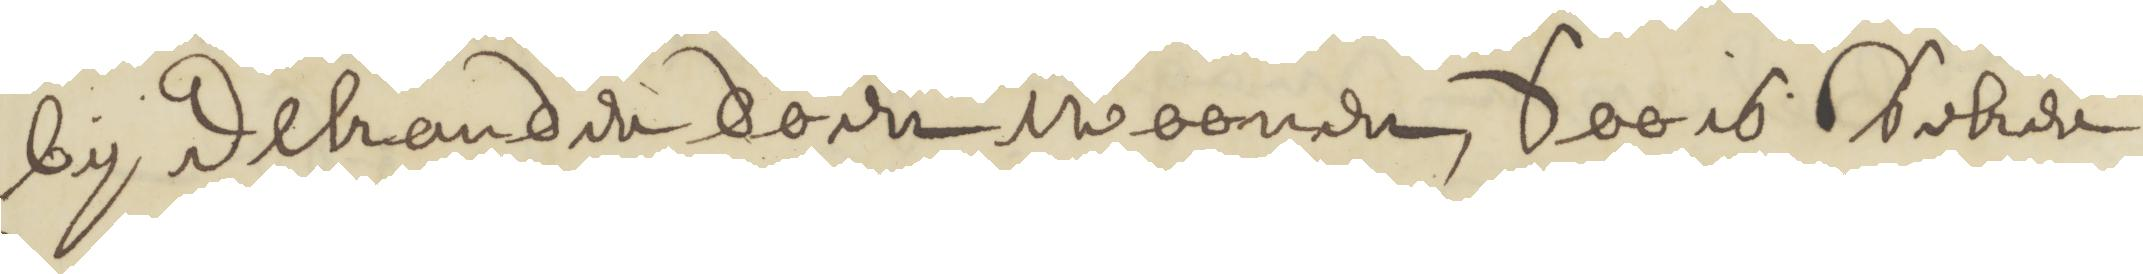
bij Elkander doen woonen, Soo is .t seker
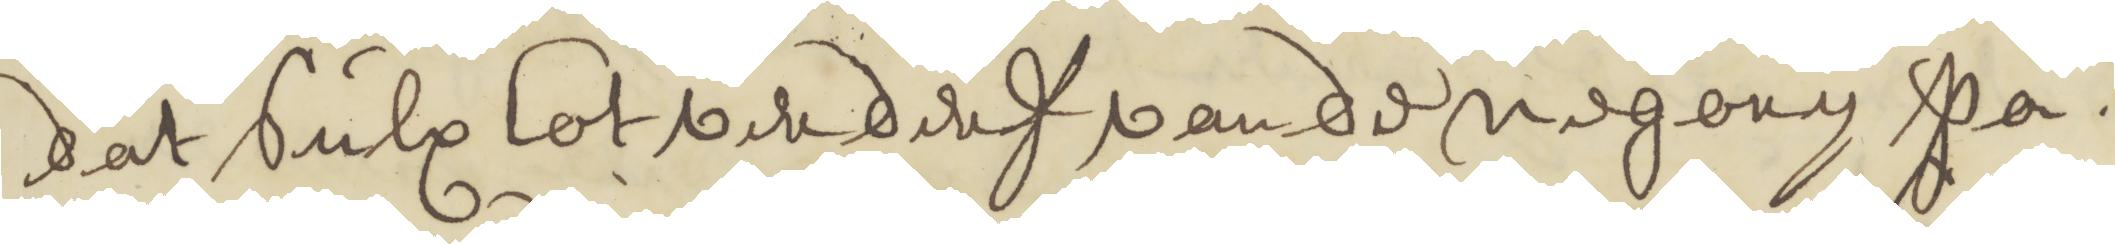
dat sulx tot verderf van de negorij pa.
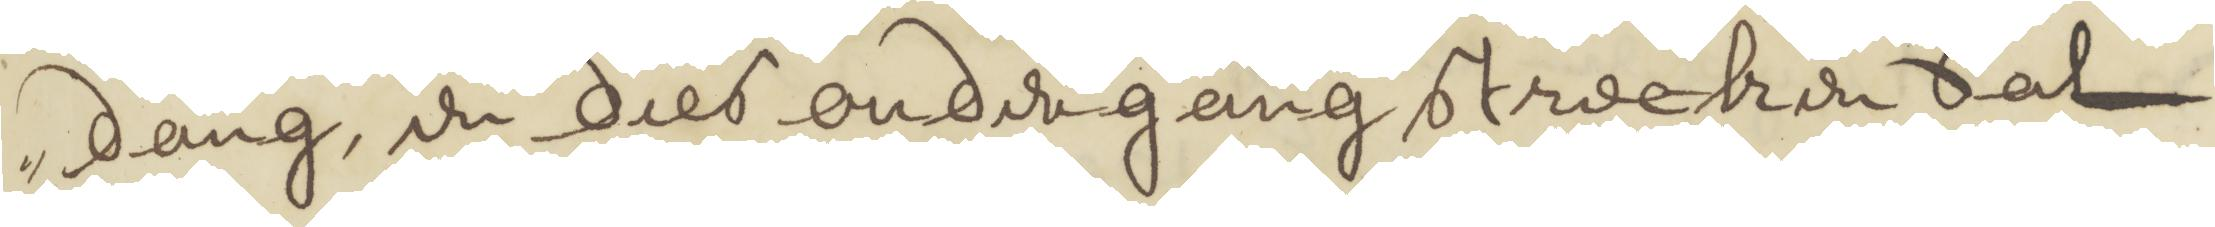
„dang, en dies ondergang strecken sal
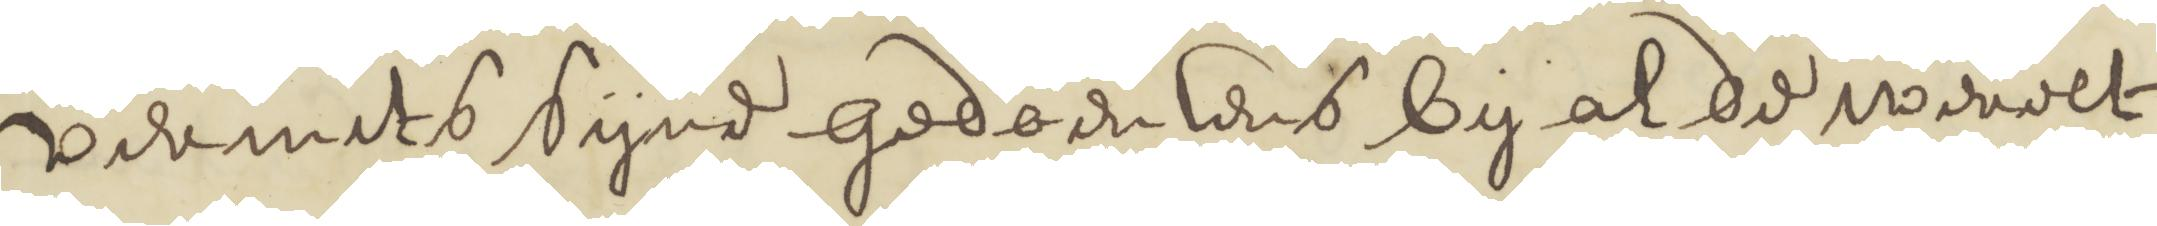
vermits sijne gedoentens bij al de werelt
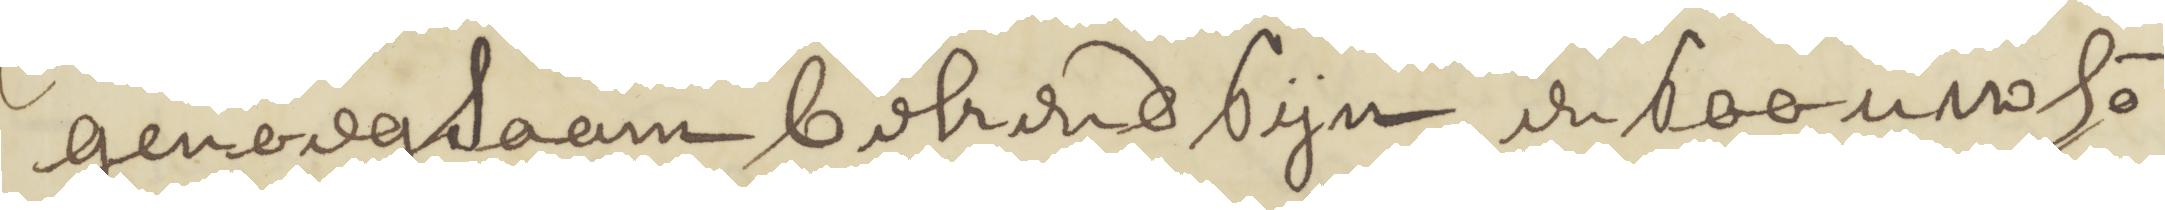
genoegsaam bekend sijn, en soo uw ho—
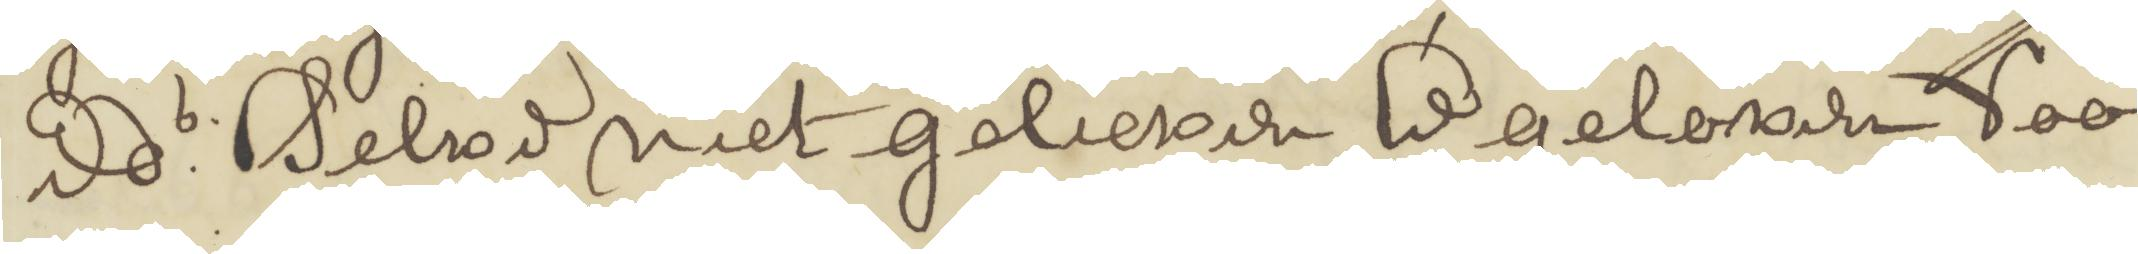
Ed:e tSelve niet gelieven te geloven, soo
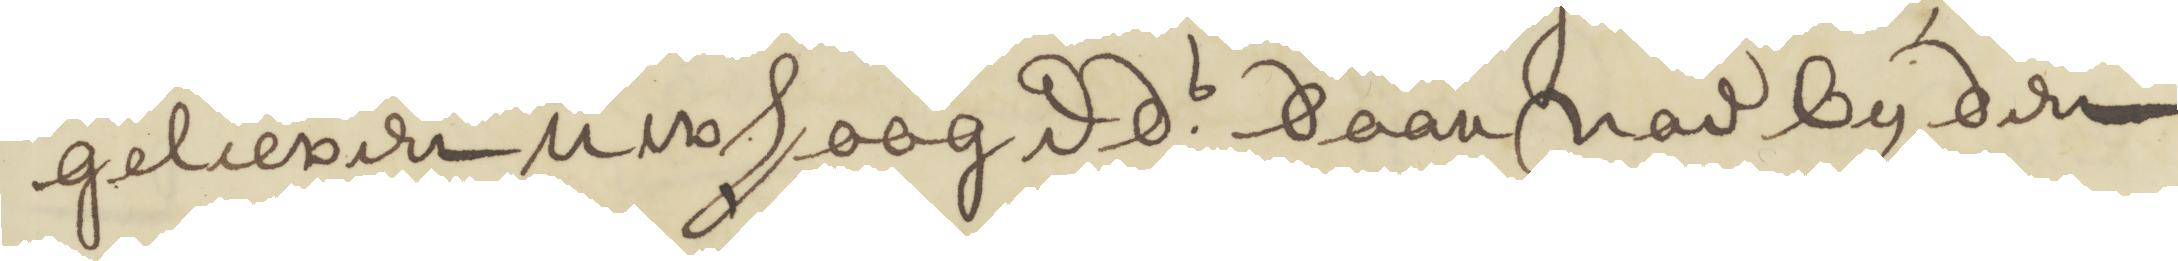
gelieven uw hoog Ed.e daan nae bij den
